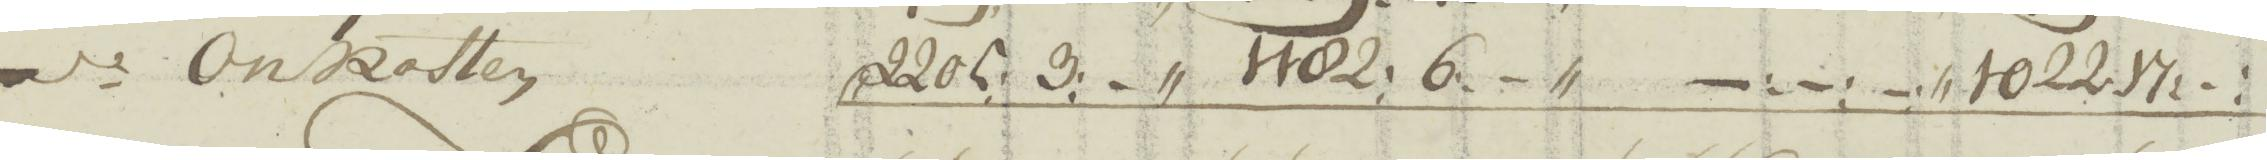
—= Onkosten „2205: 3: — „ 1182:6:— „ —: —: —. „1022:17:—:
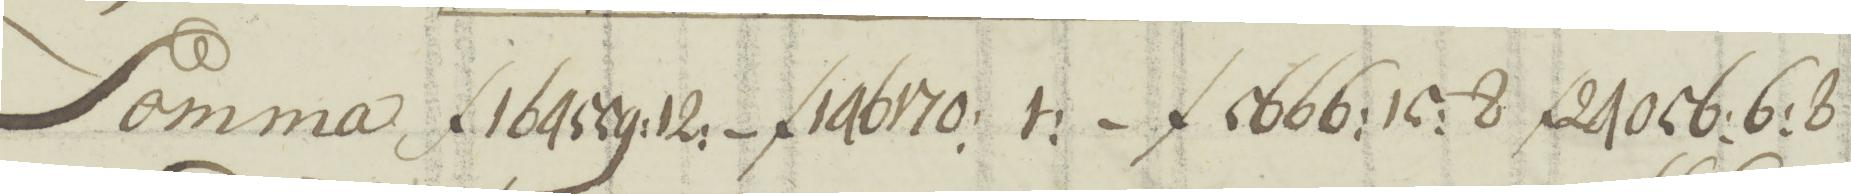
Somma ƒ164559:12:— ƒ146170: 1: — ƒ5666:15:8 ƒ24056:6:8
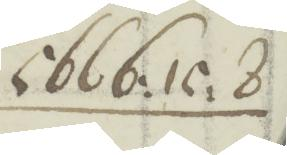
5666:15:8
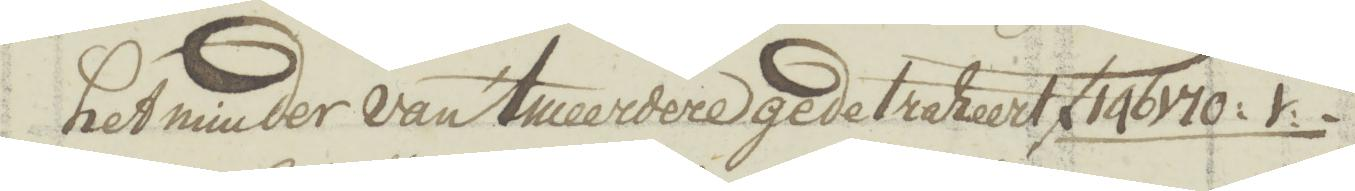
het minder van 'tmeerdere gedetraheert ƒ 146170: 1: -
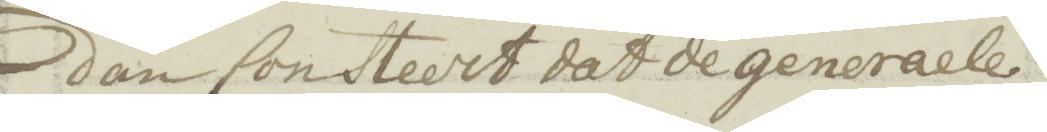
dan Consteert dat de generaele
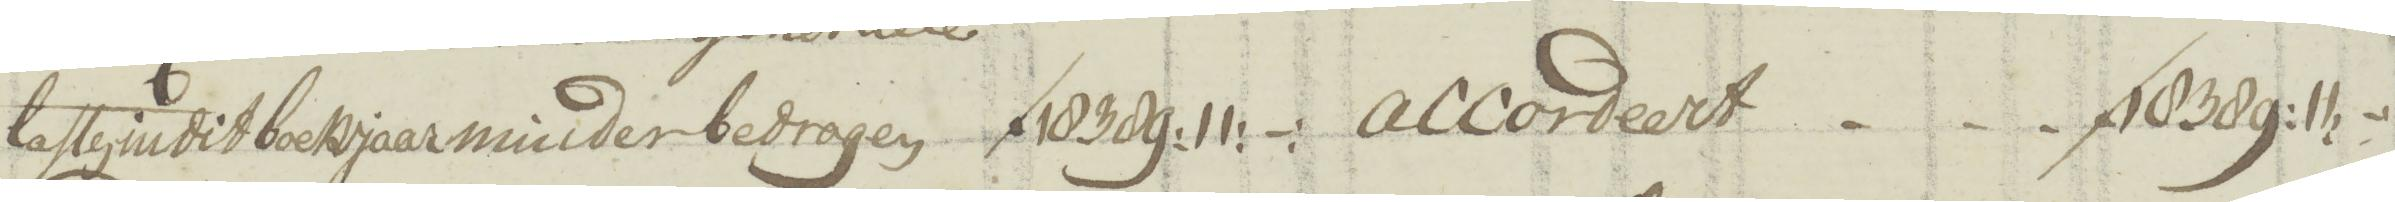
lasten in dit boekjaar minder bedragen ƒ18389:11:–: accordeert - - - ƒ18389:11: -
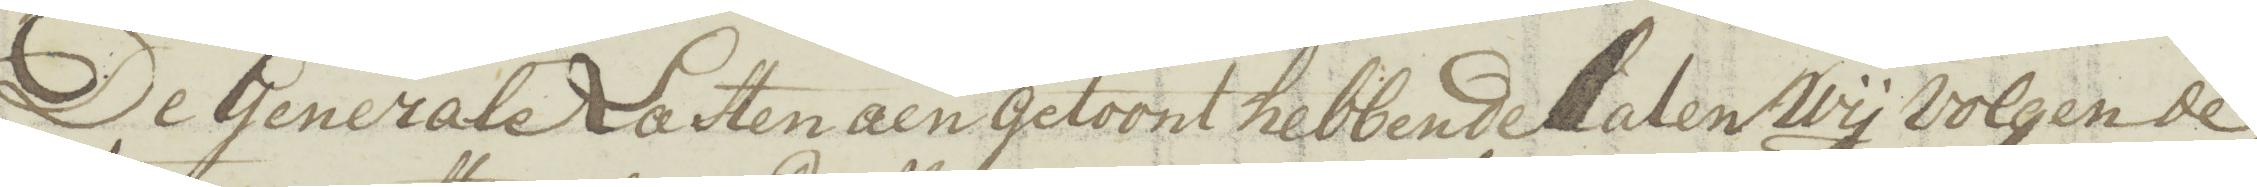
De Generale Lasten aen getoont hebbende Laten wij volgende
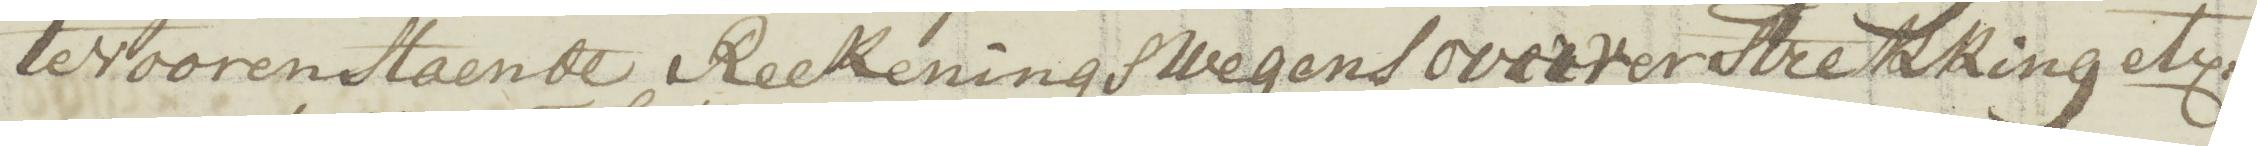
tevoorenstaende Reekeningswegens over verstrekking etc:
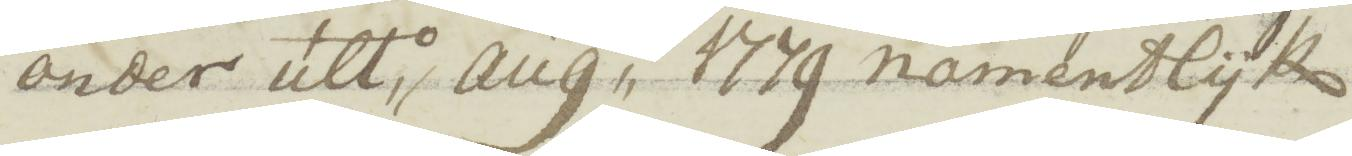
onder ult„o aug„s 1779. namentlijk
